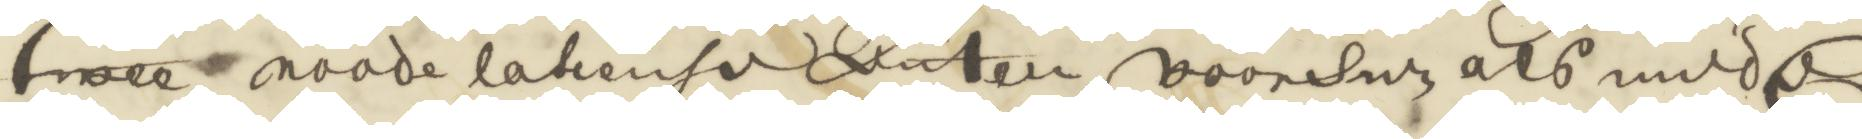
twee roode lakense tenten voorsien als mede
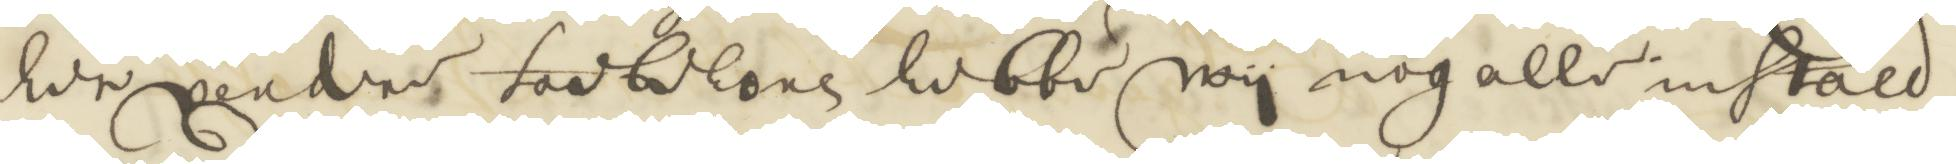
het verdere toebehoren hebbe wij nog alle in staed
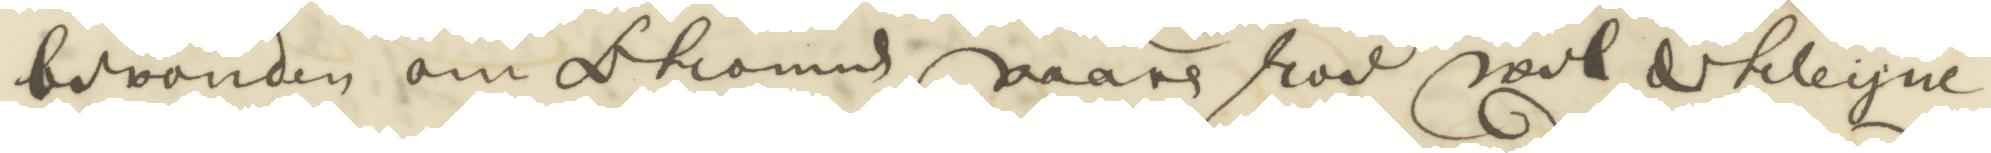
bevonden om te konnen vaaren hoe wel de kleijne
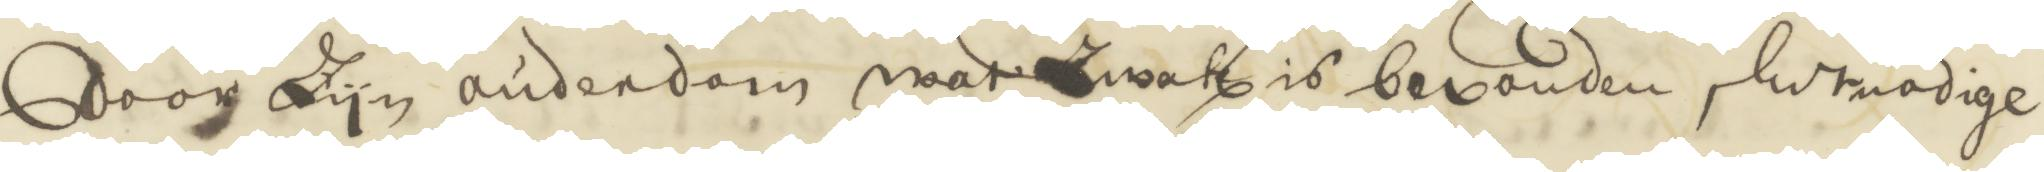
door Zijn ouderdom wat Zwak is bevonden, het nodige
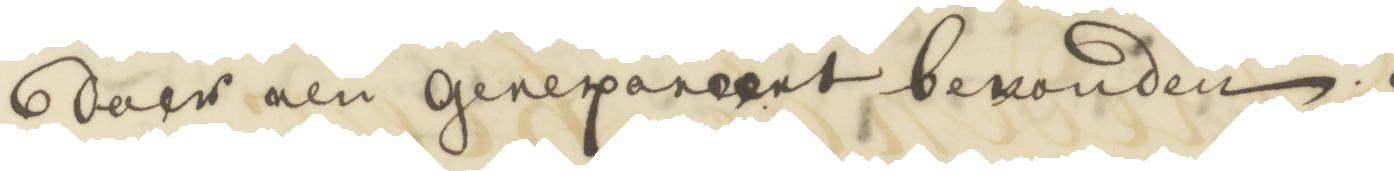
daer aen gerepareert bevonden.
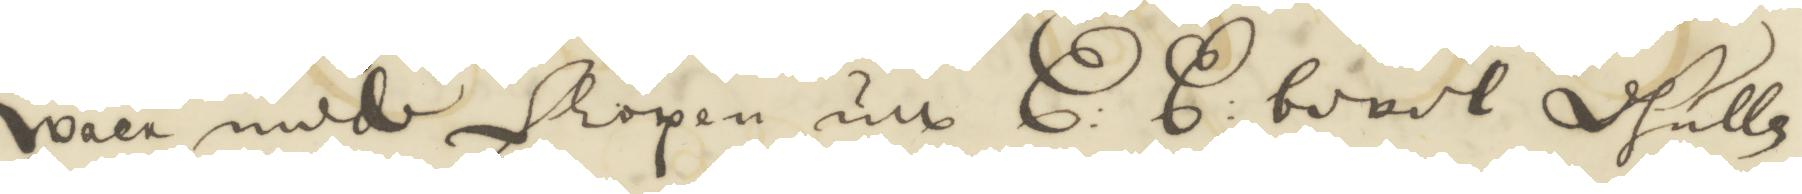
waer mede verhopen uw E: E: bevel te sullen
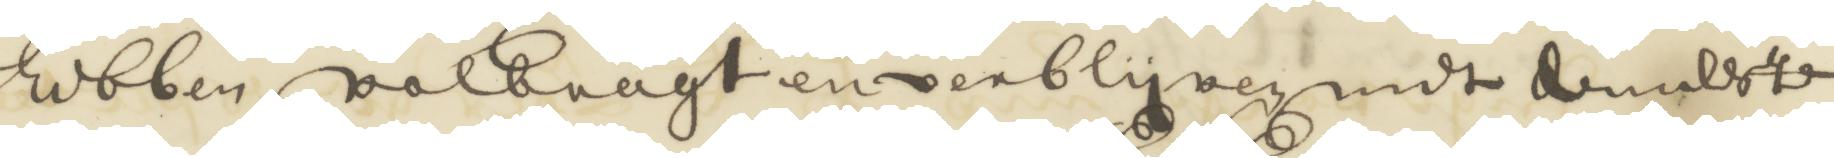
hebben volbragt en verblijven met de meeste
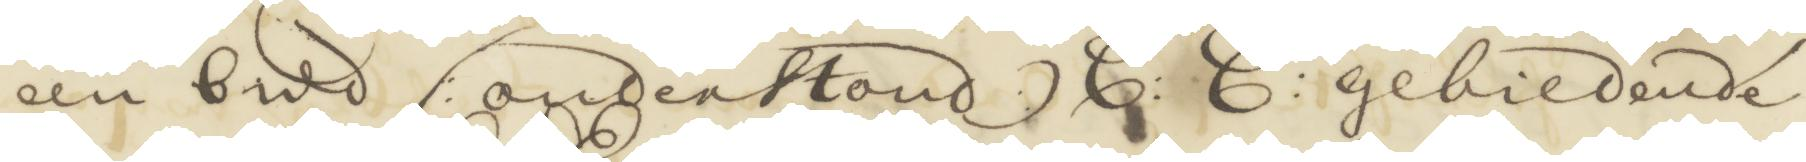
eerbied (: onder stond :) E: E: gebiedende
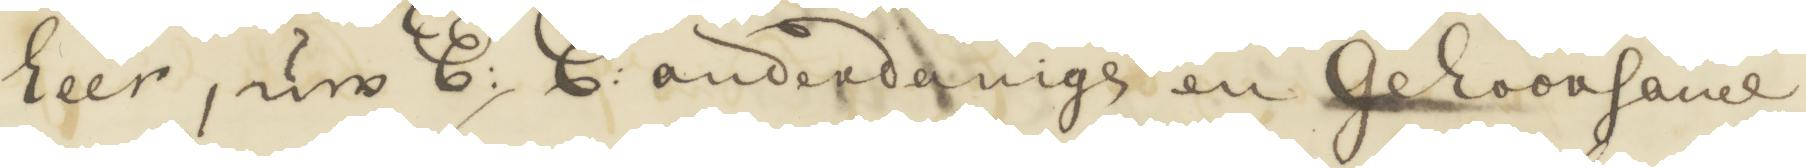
heer, uw E: E: onderdanigen en Gehoorsame
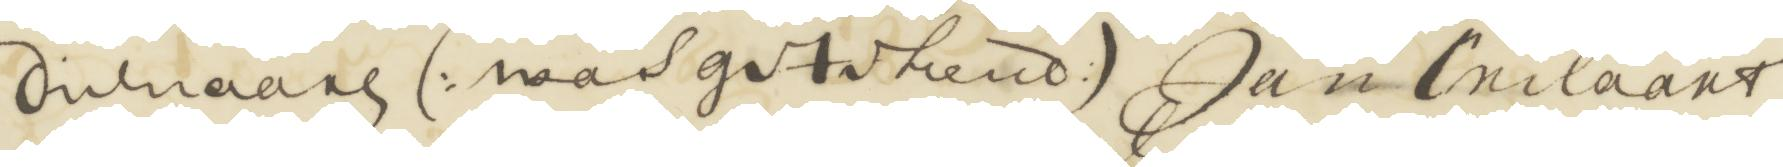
dienaaren (: was getekend :) Jan Crilaart
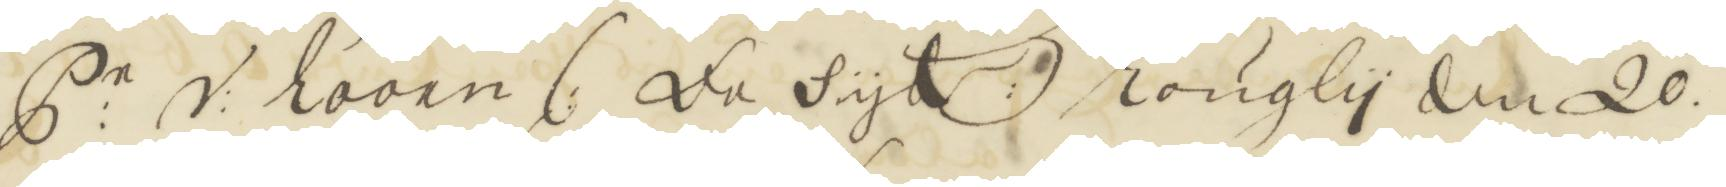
P:r v: hoorn (: ter sijde :) houglij den 20.
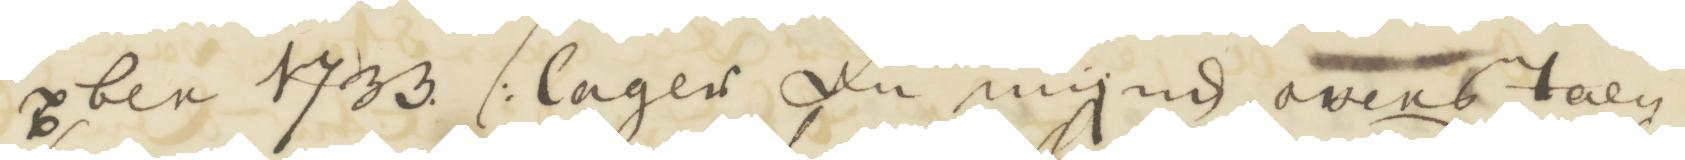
xber 1733. (: lager ten mijne overstaen
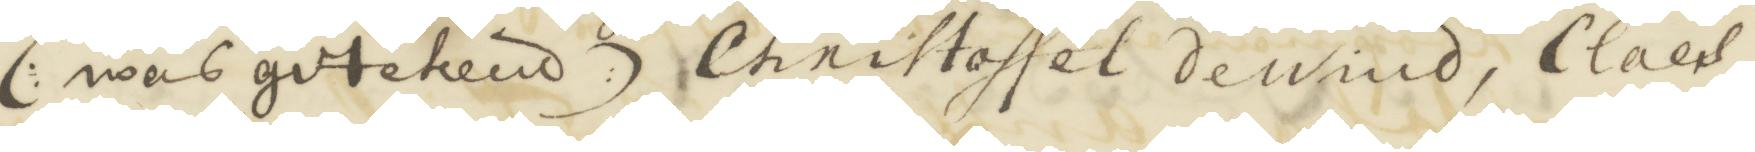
(: was getekend :) Christoffel de Wind, Claes
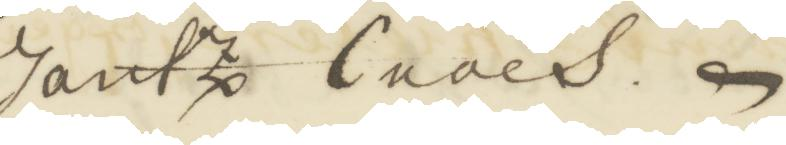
Jansz Croes.
